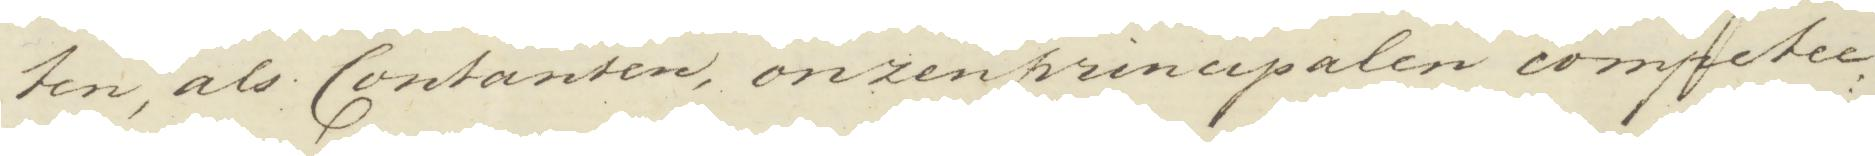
ten, als Contanten, onzen principalen competee:
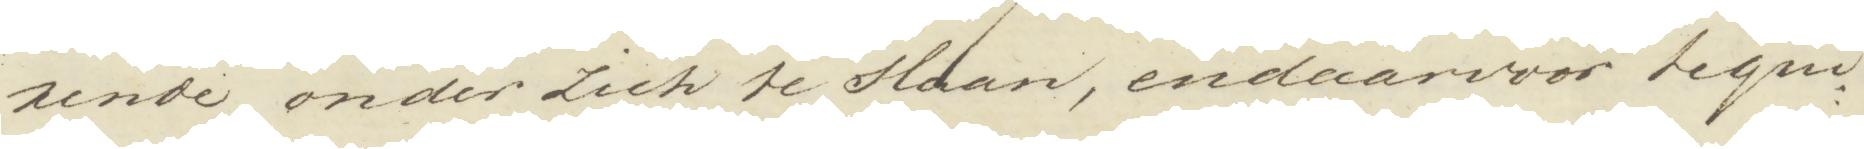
rende, onder zich te slaan, endaarvoor te qui:
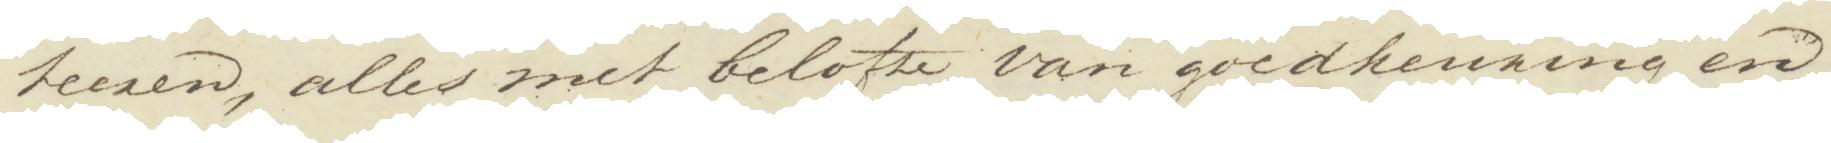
teeren, alles met belofte van goedkeuring en
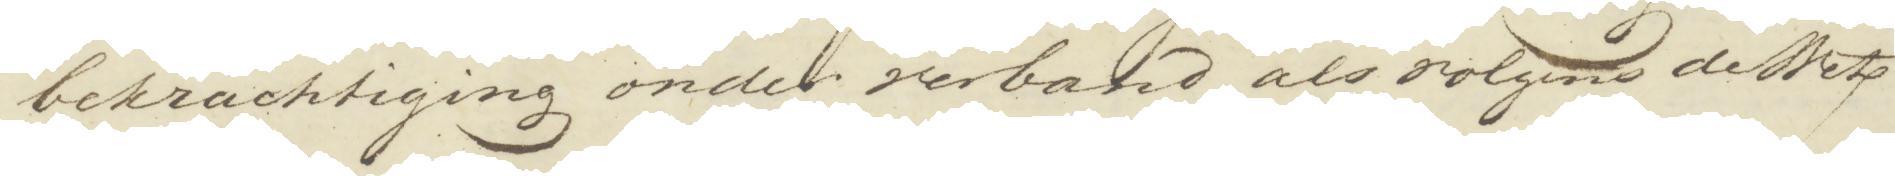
bekrachtiging onder verband, als volgens de Wet
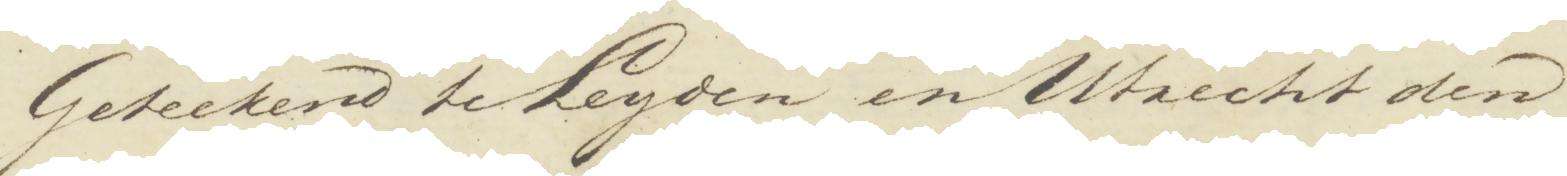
Geteekend te Leyden en Utrecht den
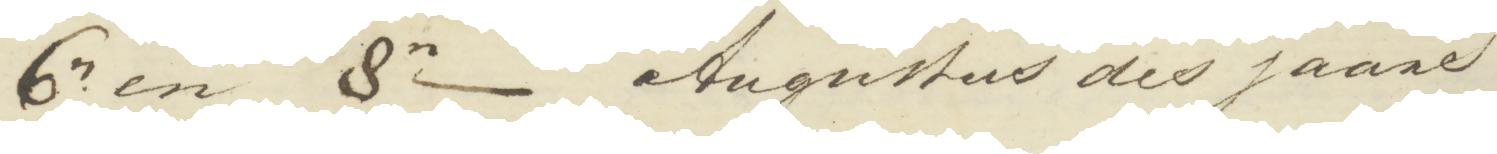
6.n en 8-n Augustus des jaare
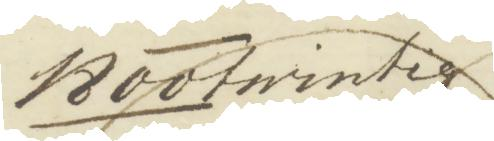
1800 twintig
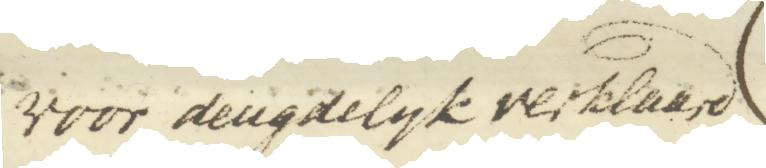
voor deugdelijk verklaard
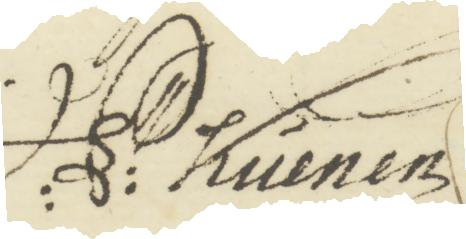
P:K: Kuenen
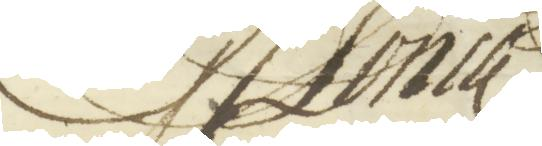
GJ Loncq
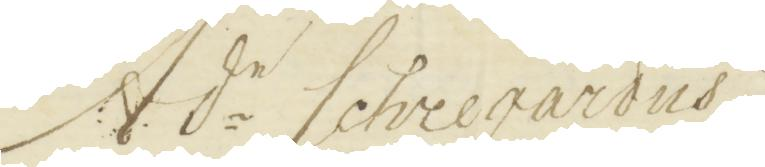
A: d=n Schregardus.
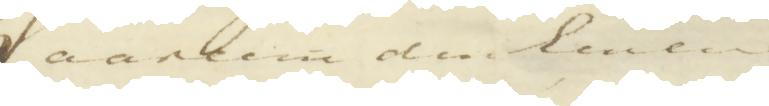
Haarlem den Een en
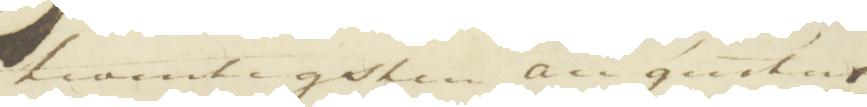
twintigsten augustus
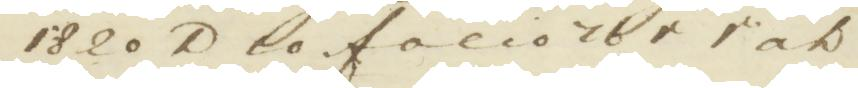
1820 D 10 folio 76v Vak
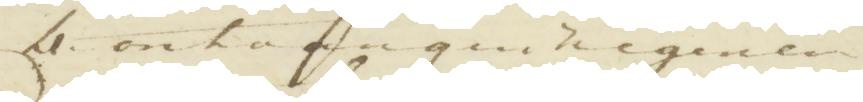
4 ontvangen Negen en
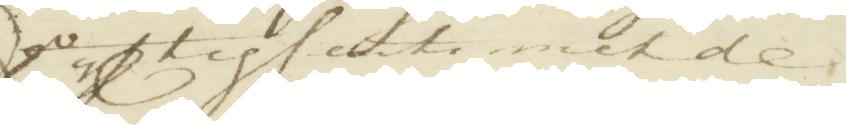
Vyftig Cents met de
